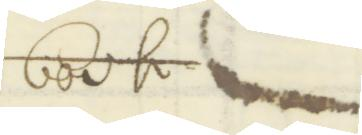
boek
